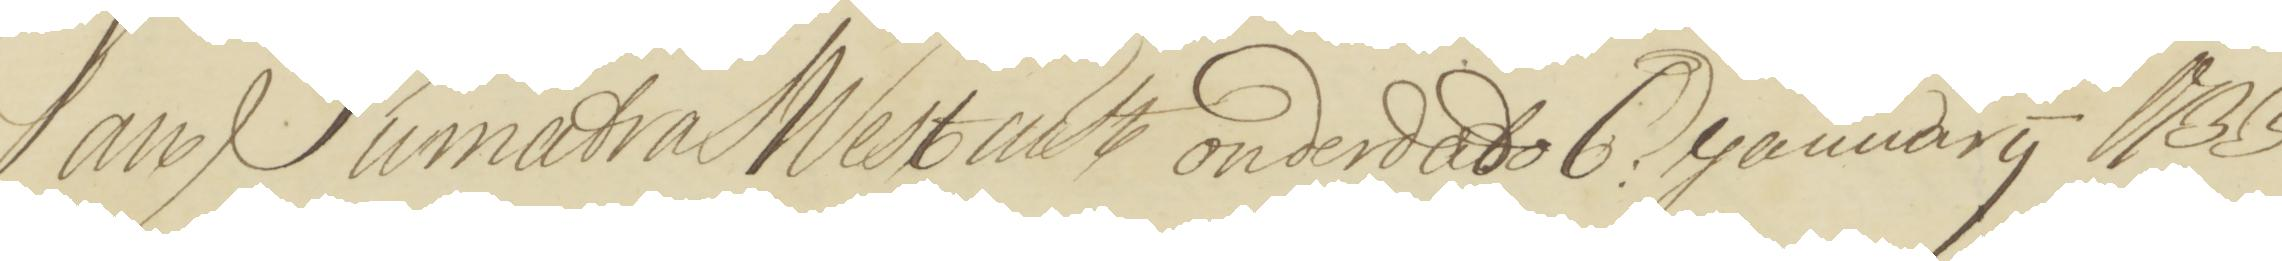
Van Sumatras West cust onderdato 6: Januarij 1733.
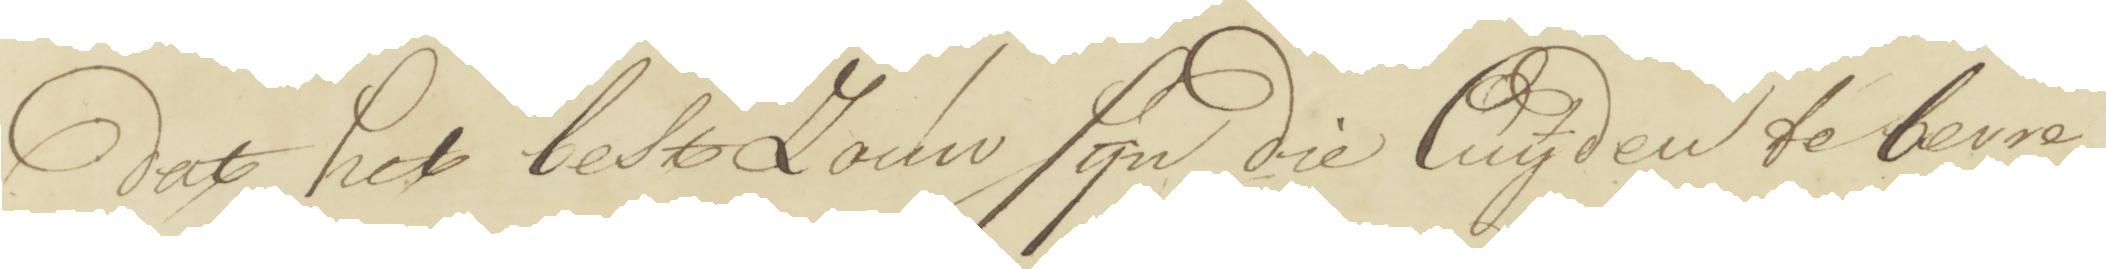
dat het best zouw sijn die luijden te bevre,
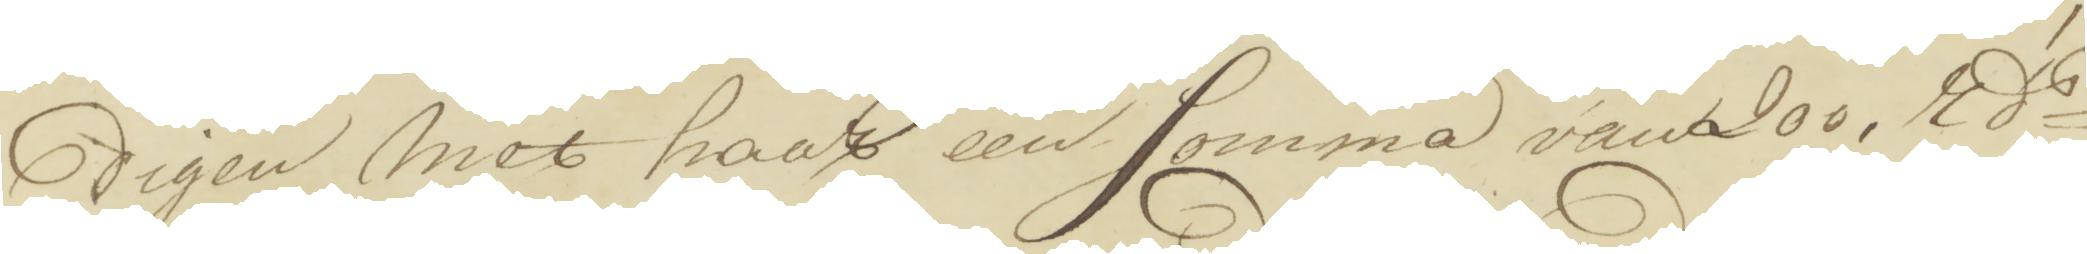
digen met haar een somma van 200 rd=s
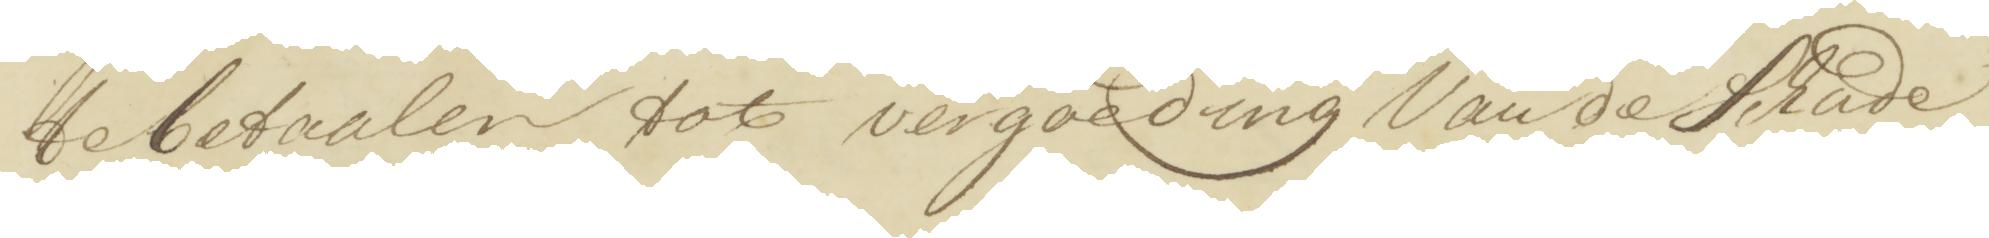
te betaalen tot vergoeding van de schade
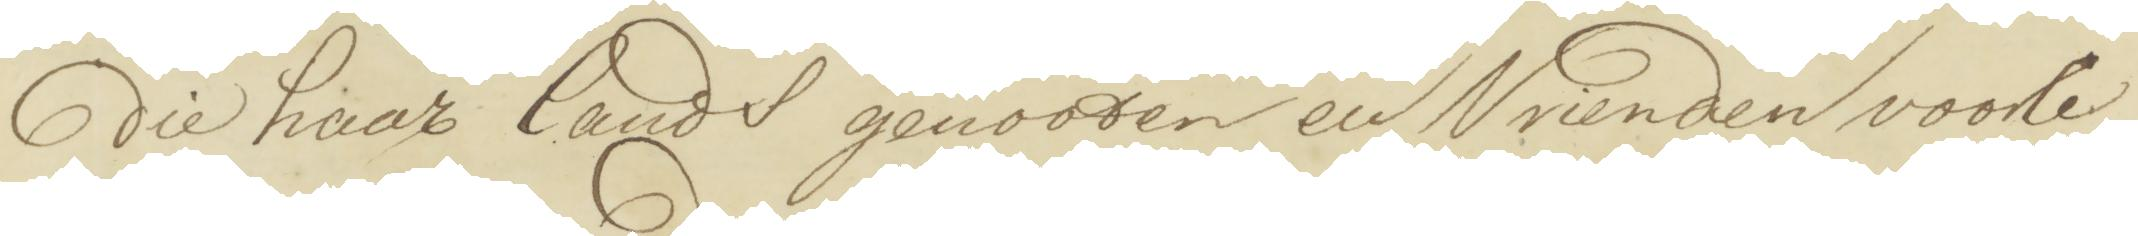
die haar lands genooten en vrienden voorle
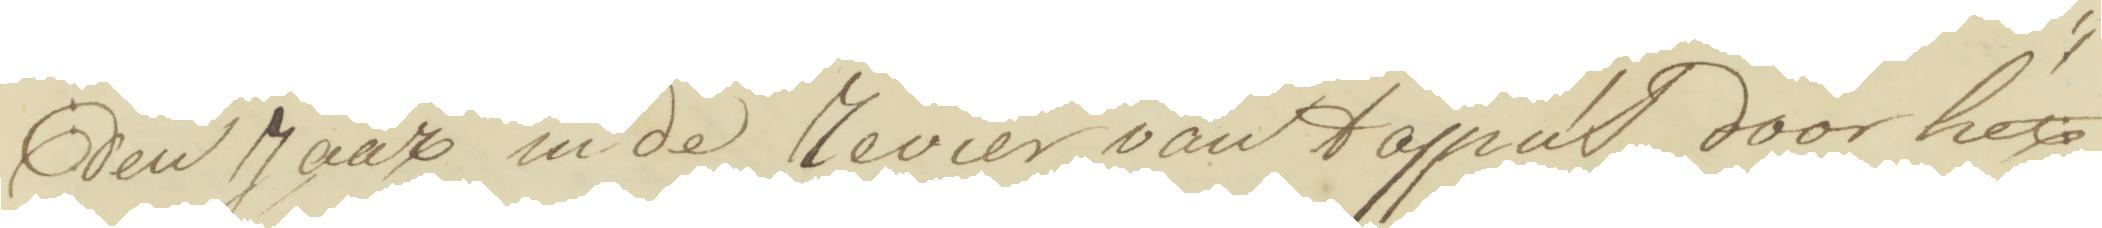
den Jaar in de revier van tappus door het
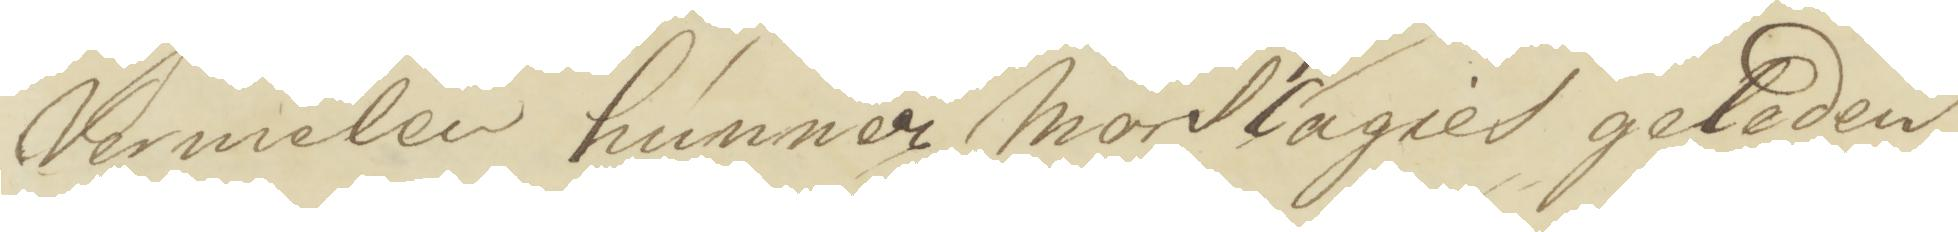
vernielen hunner morscagies geleden
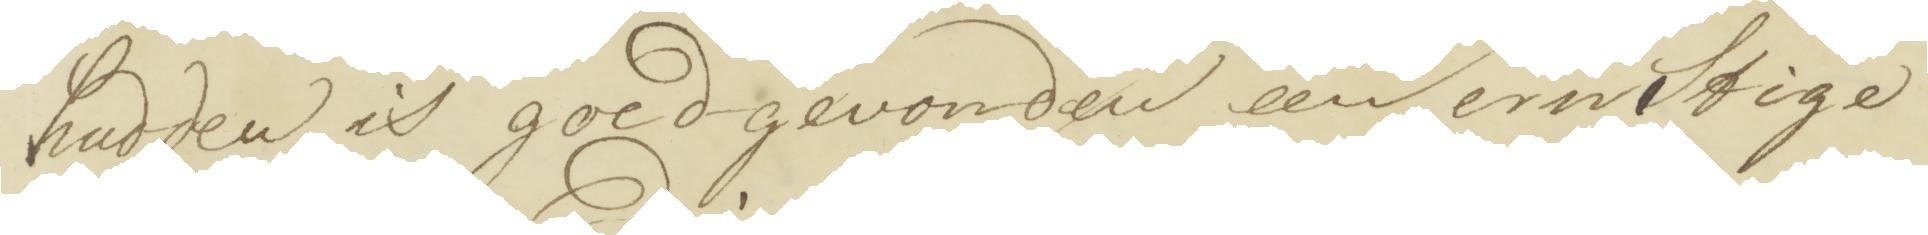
hadden is goed gevonden een ernstige
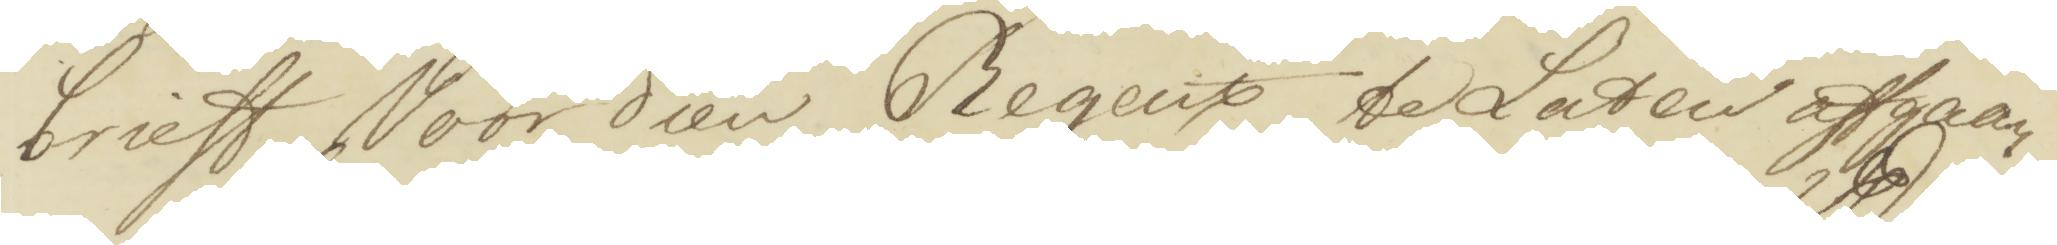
brieff voor dien Regent te Laten affgaan
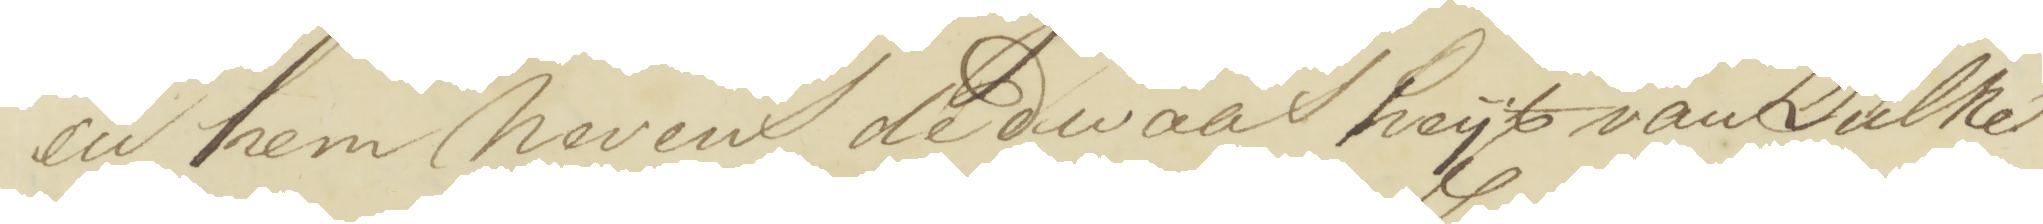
en hem nevens de dwaasheijt van zulke
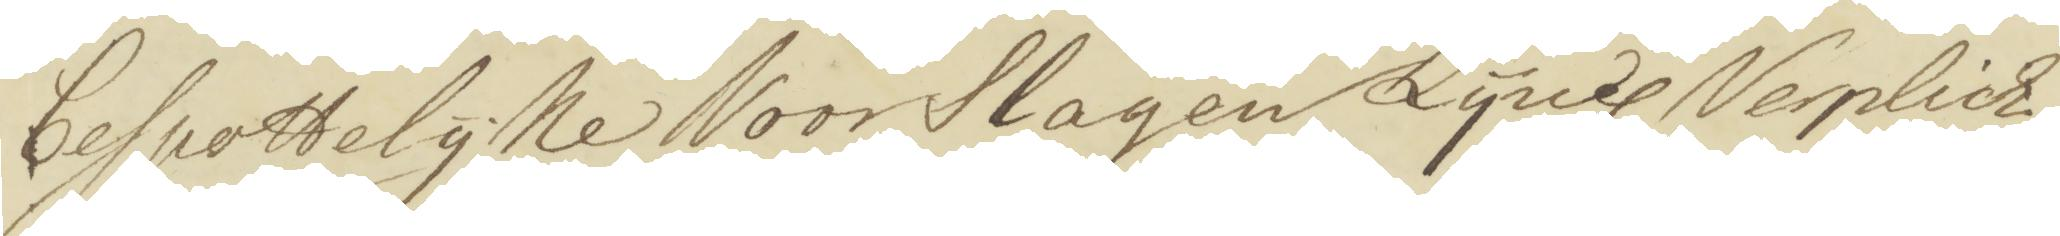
bespottelijke voorslagen zijne verplich
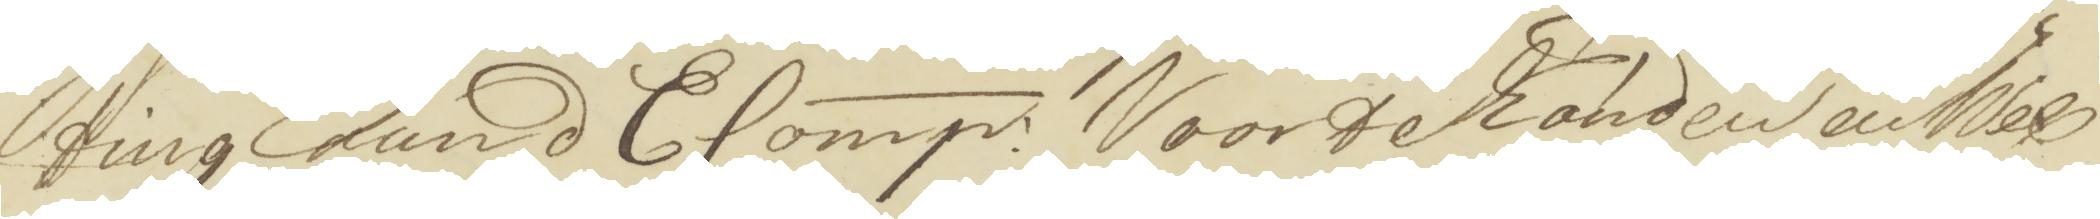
ting aan d E Comp: voor te houden en wel
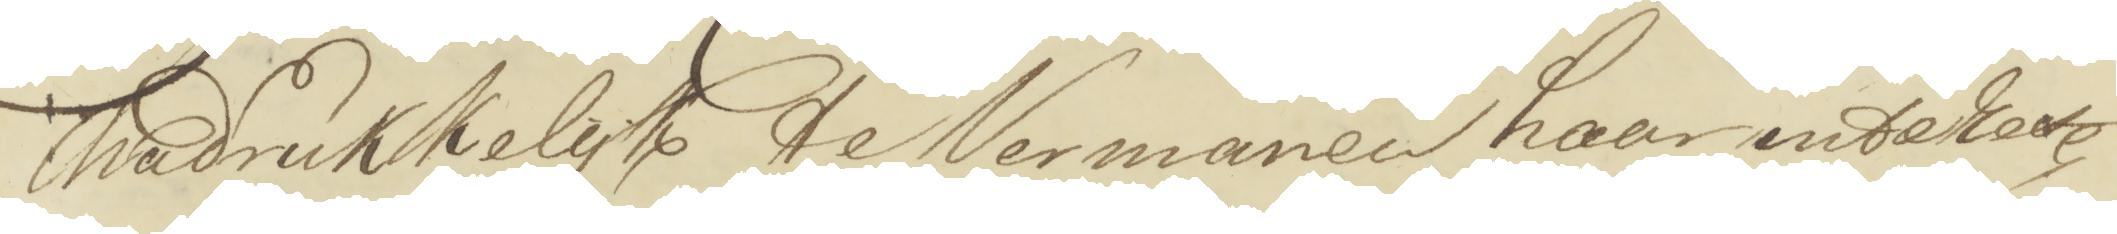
nadrukkelijk te vermanen haar interest
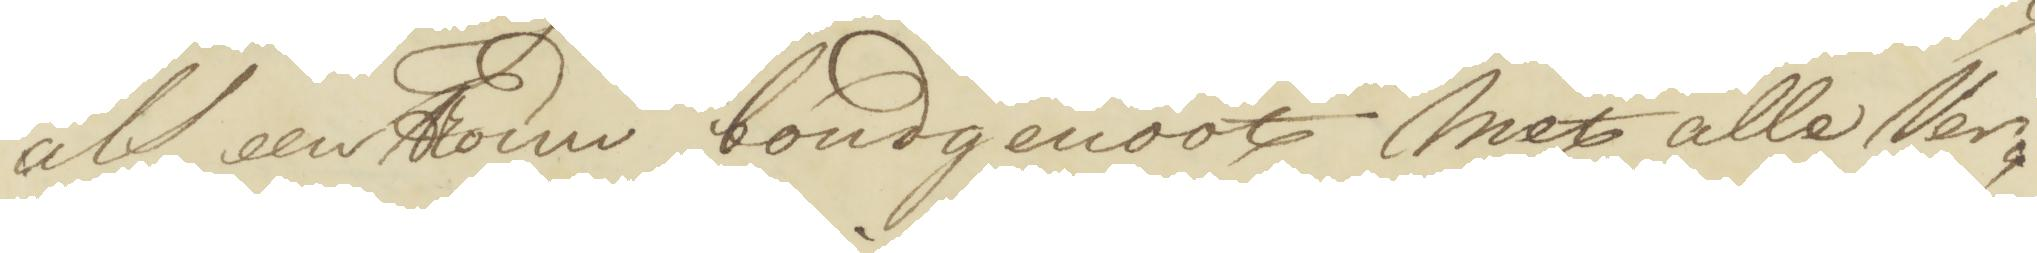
als een trouw bondgenoot met alle ver„
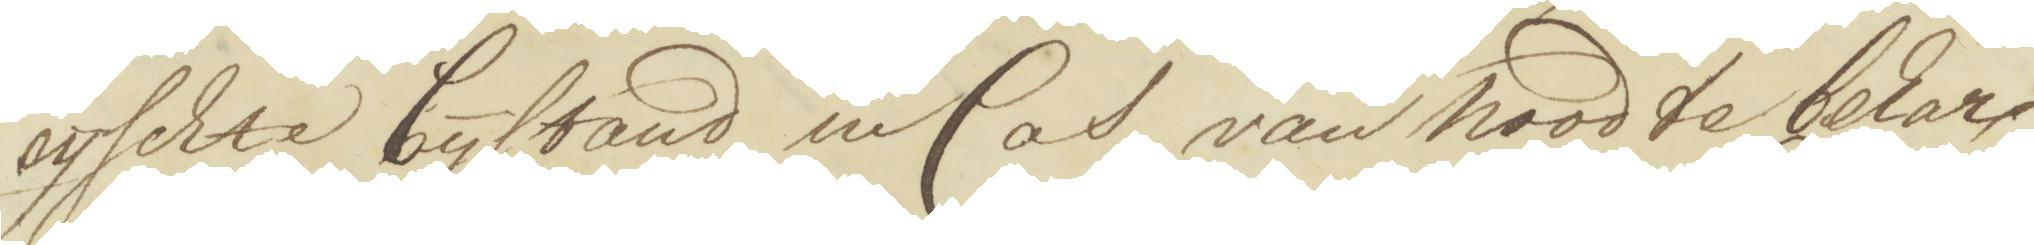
eijschte bijstand in Cas van nood te behar
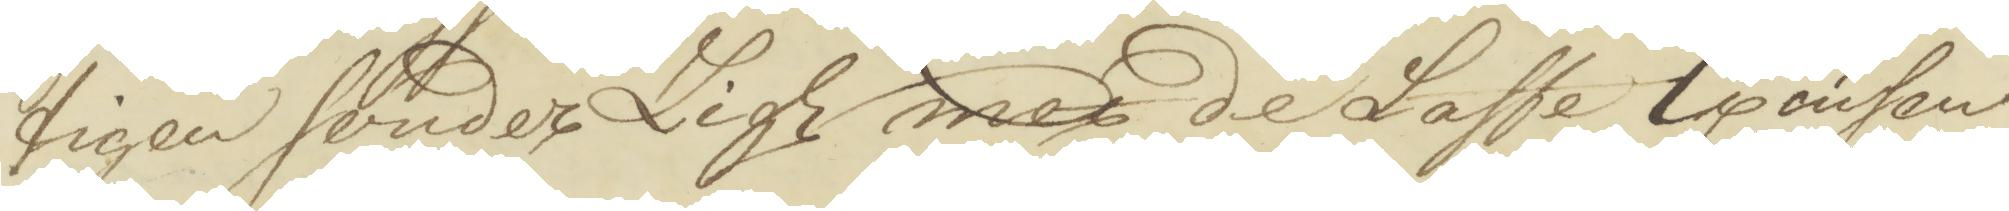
tigen sonder zigh met de laffe Excusen
